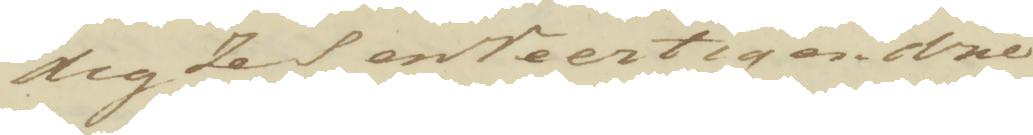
dig Zes en Veertig en drie
